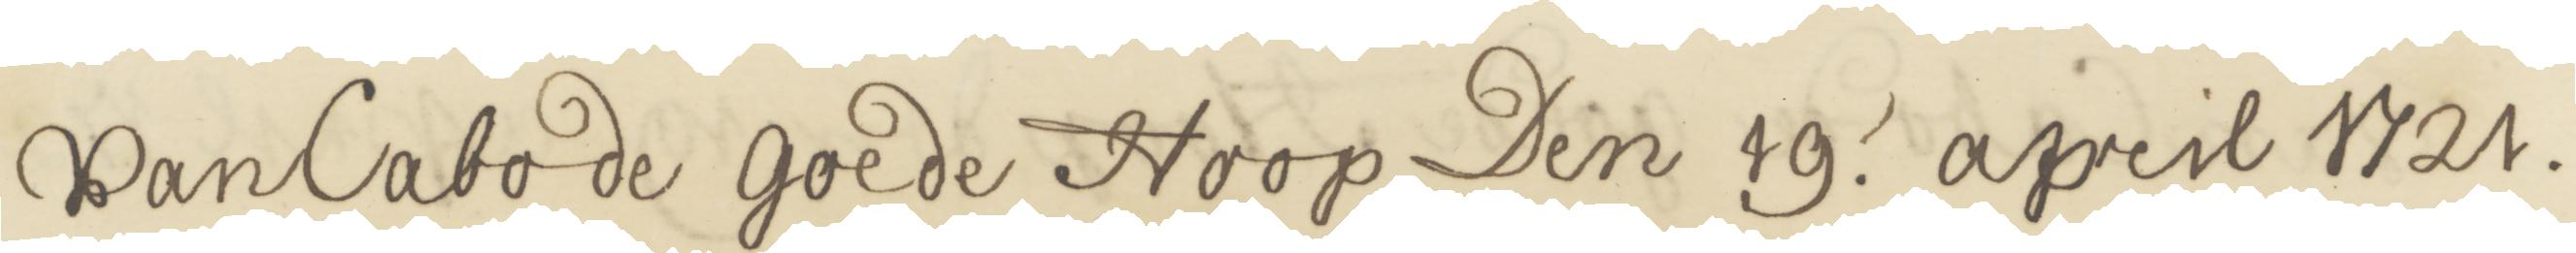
Van Cabo de goede Hoop Den 19.' april 1721.
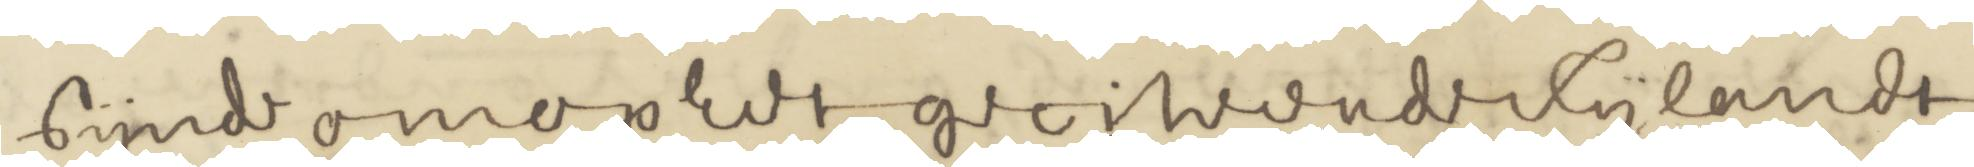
sijnde om op het geciteerde Eijlandt
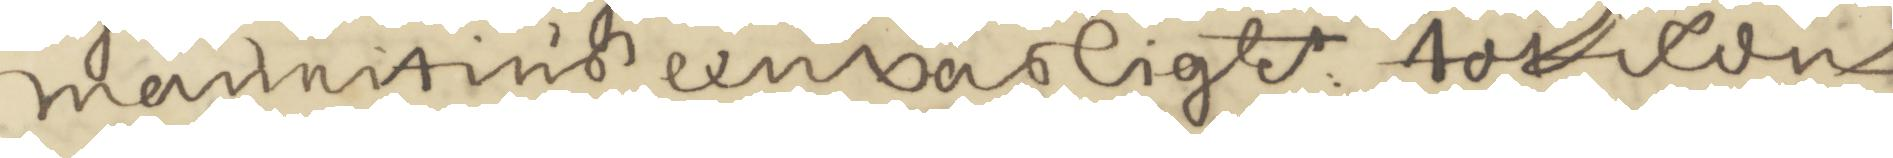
mauritius een vastigh:t tot Een
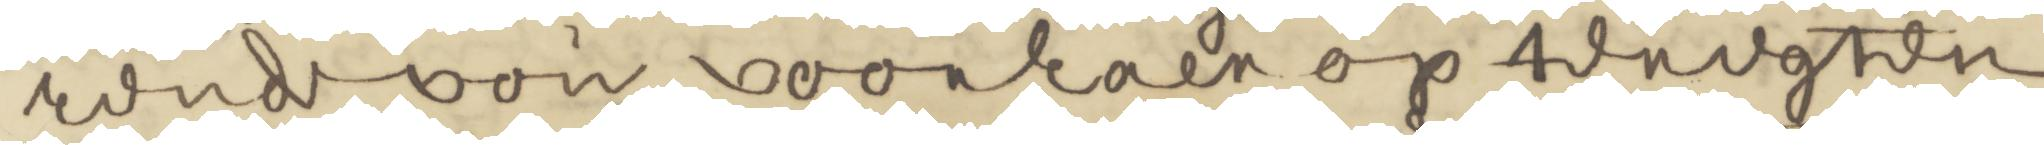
rendevou voor haer op teregten
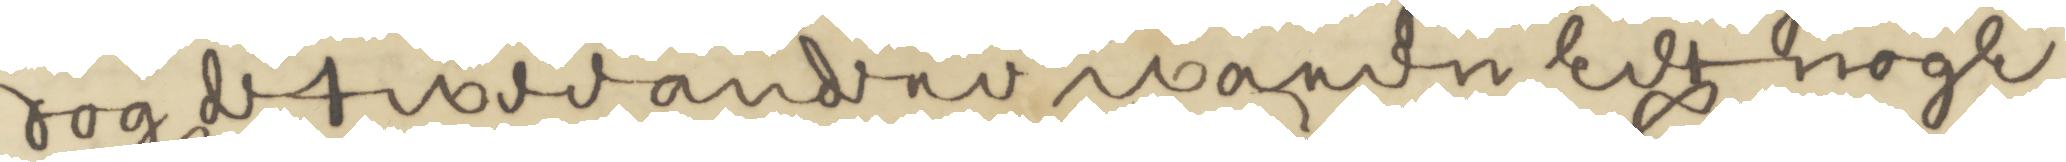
dog de twee andere waren het nogh
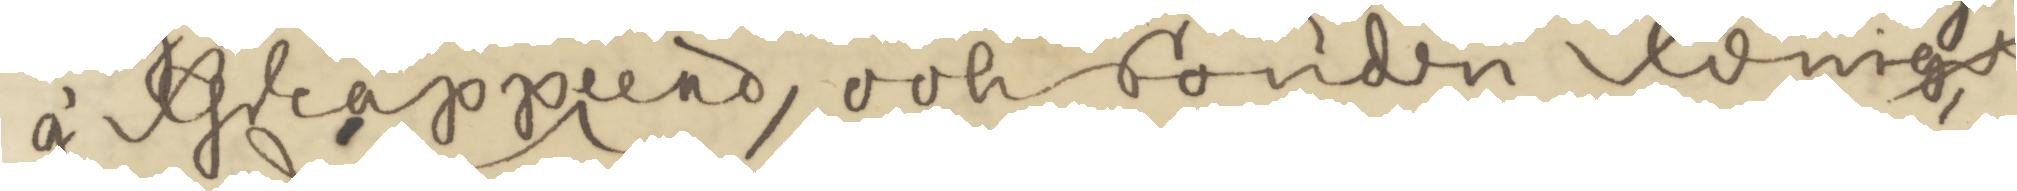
g' Eschappeerd, ook souden Eenige
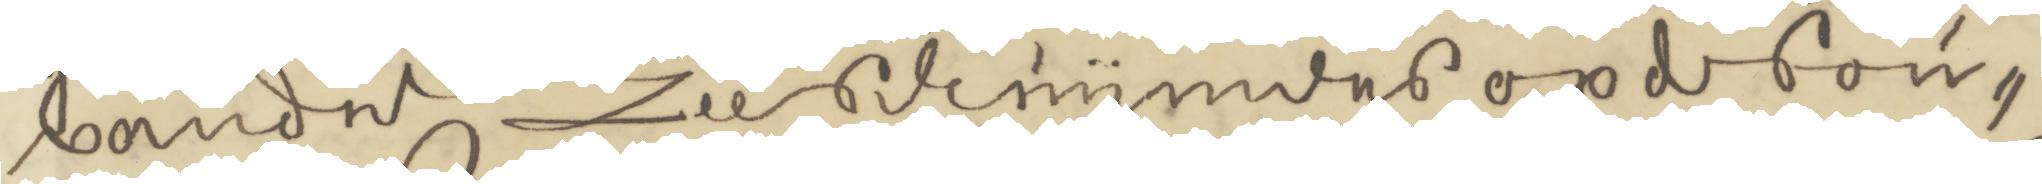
vandie zeeschuijmers op de sou„
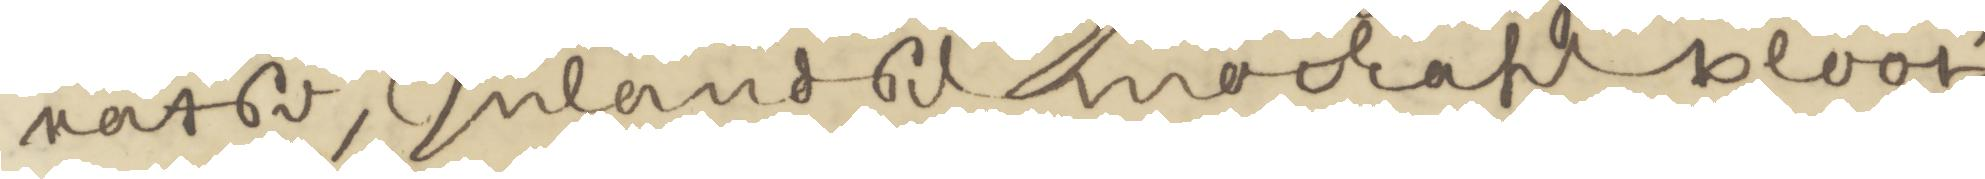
ratse, Jnlandse mochase vloot
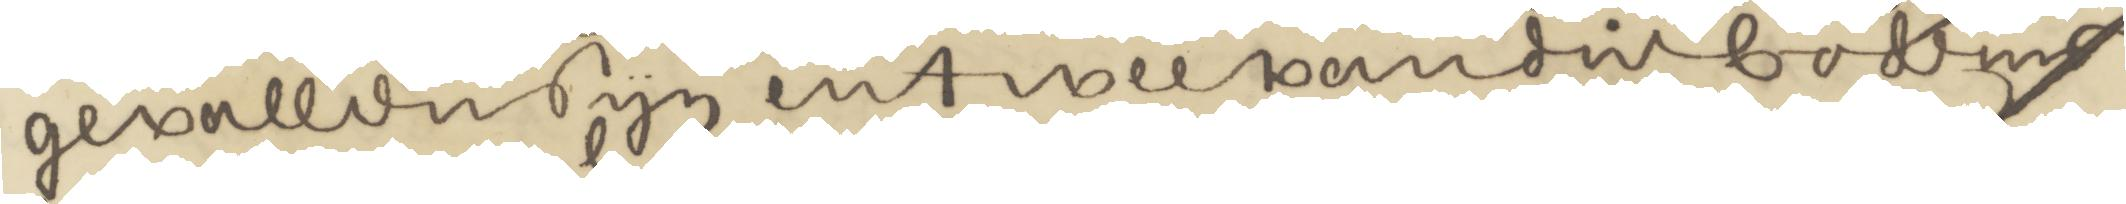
gevallen sijn en twee van die bodems
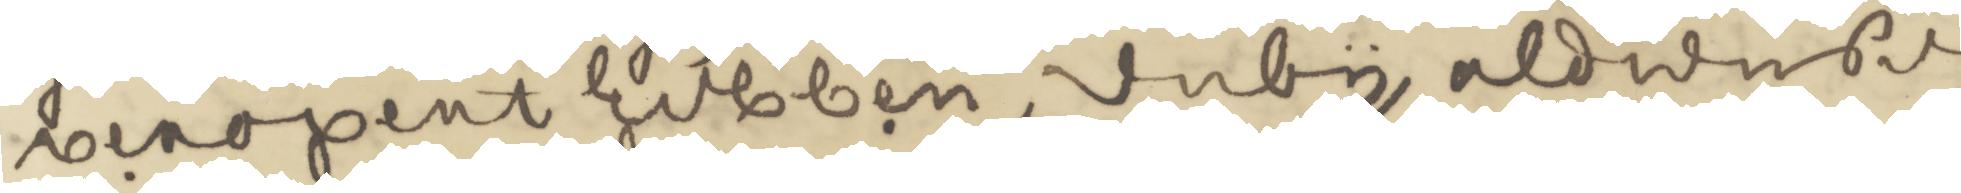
veropent hebben, en bij aldiense
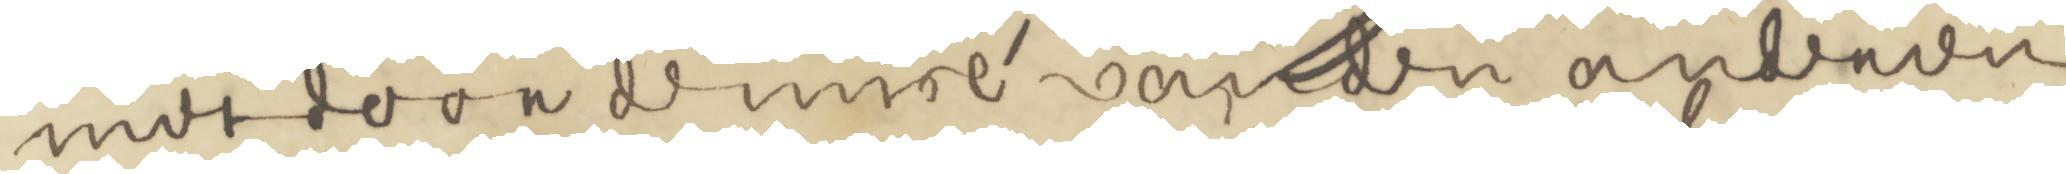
niet door de mist vanden anderen
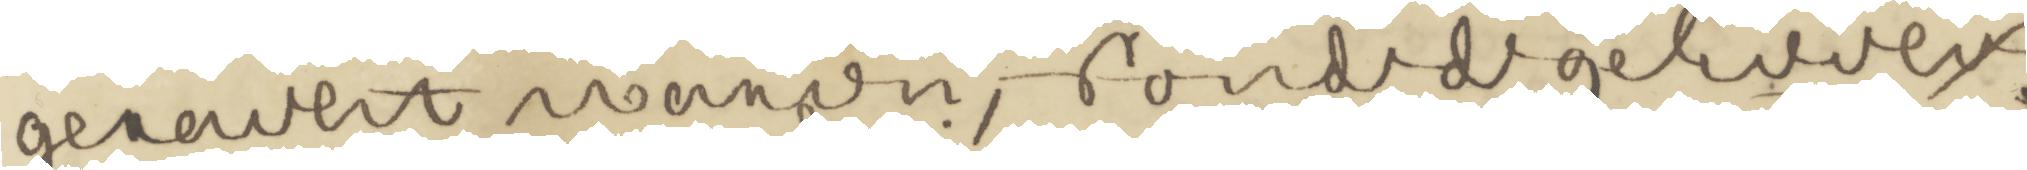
geraekt waren, soude de geheele
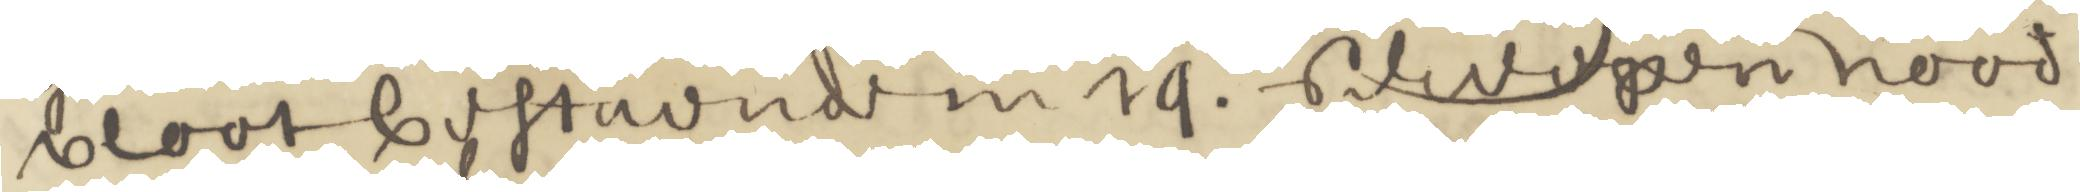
vloot bestaende in 14. scheepen nood
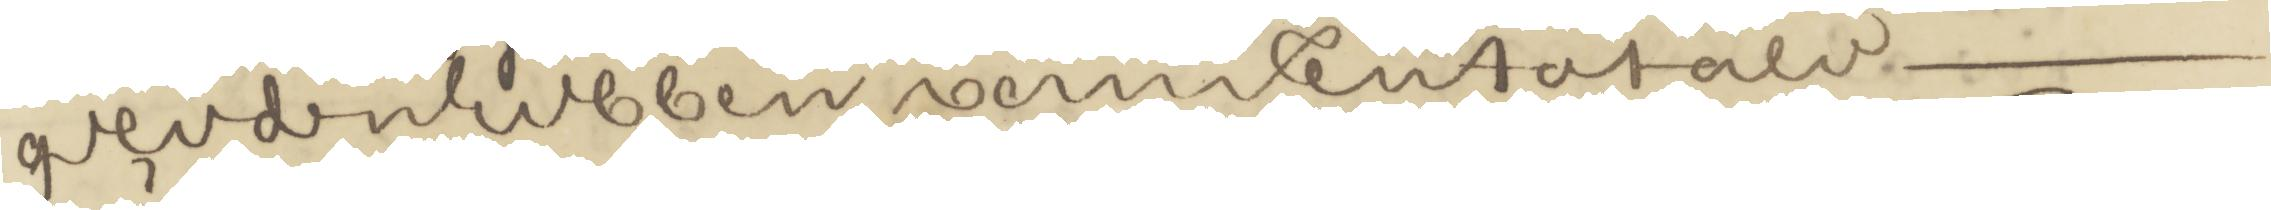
geleden hebben van Een totale —
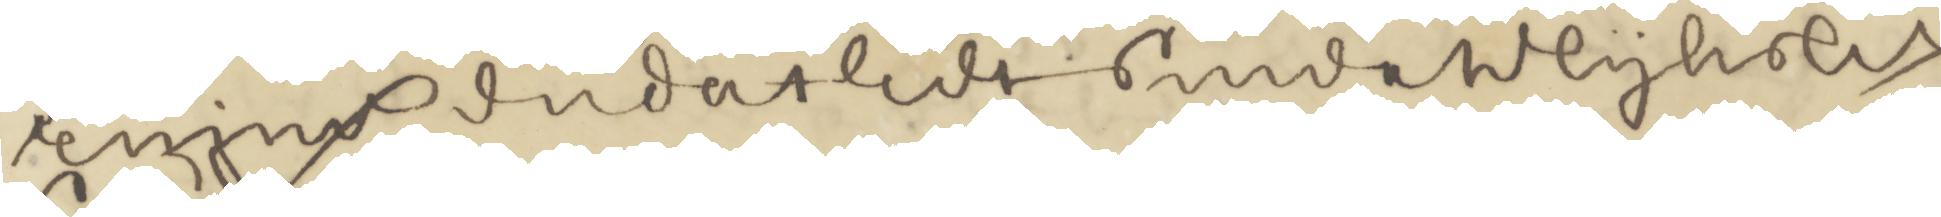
ruine en dat het smertelijkste
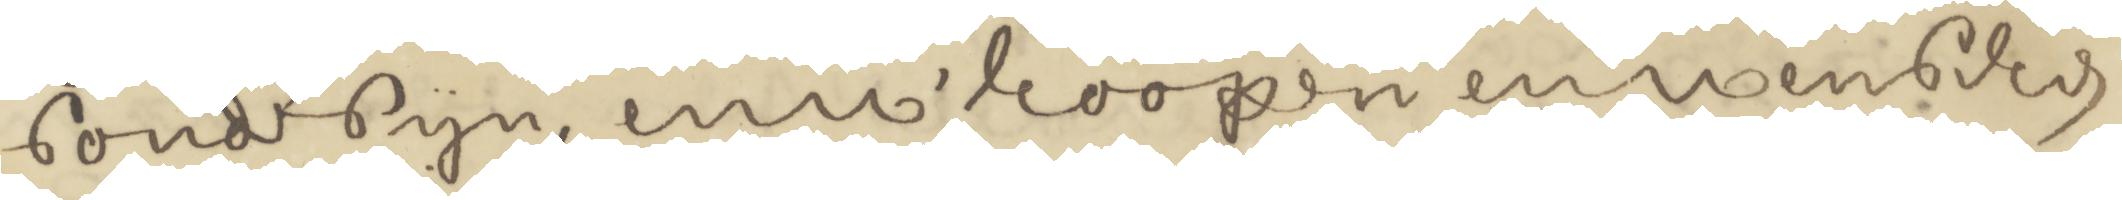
soude sijn, en w' hoopen en wenschen
